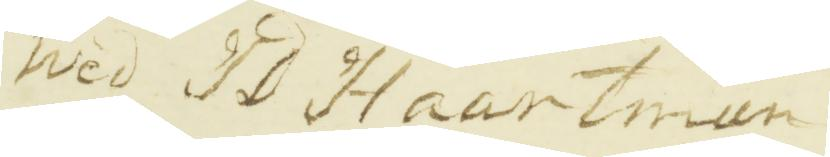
wed ID Haartman
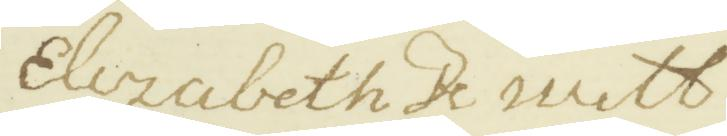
Elizabeth De witt
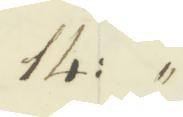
14: „
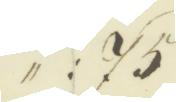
„ : 75
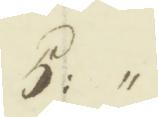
5: „
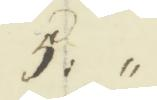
5„ „
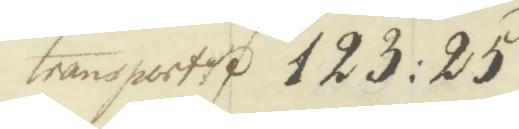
transport ƒ 123: 25
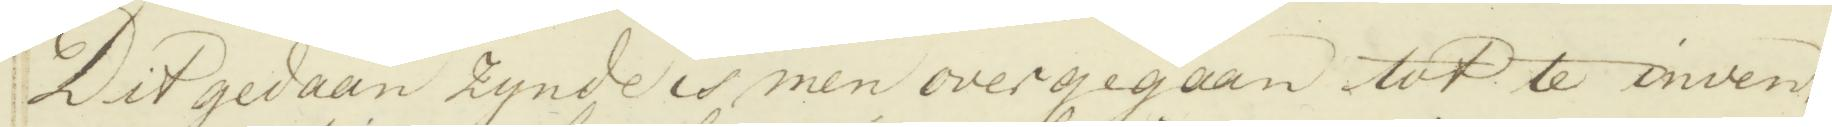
Dit gedaan zijnde is men overgegaan tot te inven„
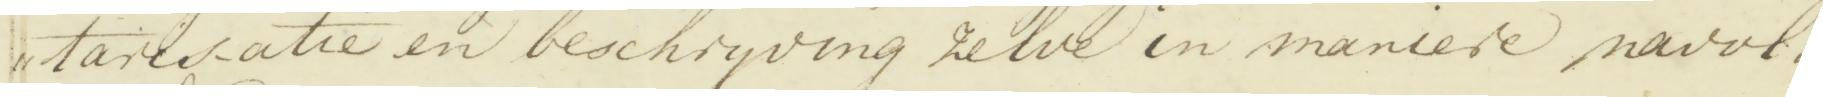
„tarisatie en beschryving zelve in maniere navol„
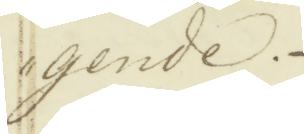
„gende.
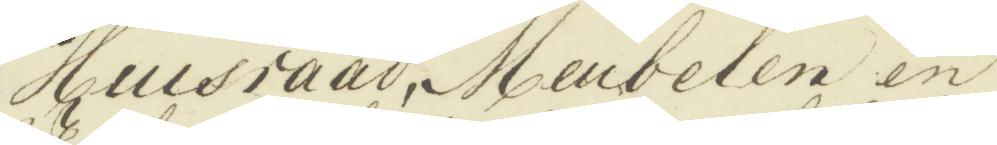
Huisraad, Meubelen en
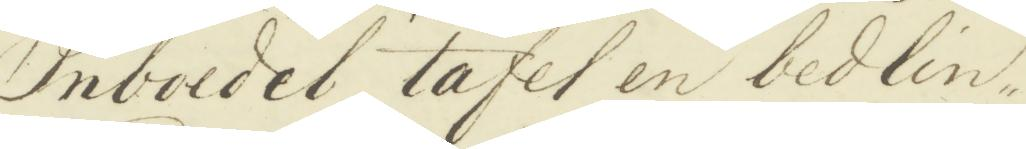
Inboedel, tafel en bedlin„
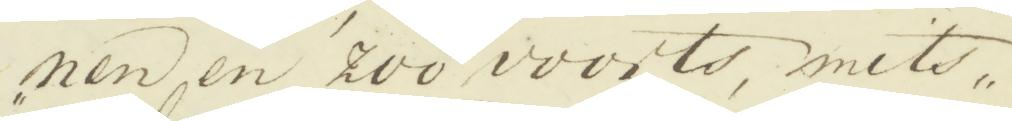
„nen, en zoo voorts, mits„
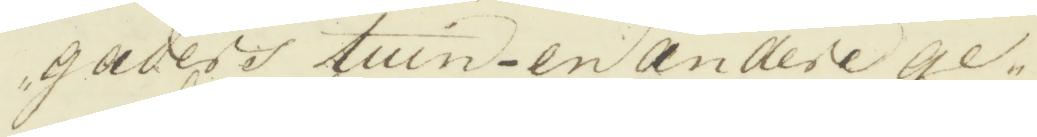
„gaders tuin- en andere ge„
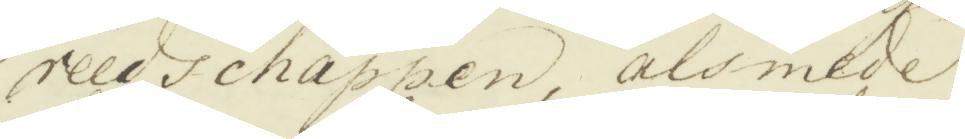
reedschappen, alsmede
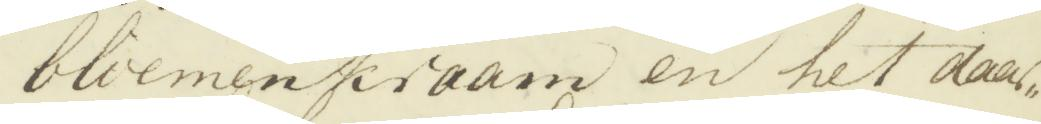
bloemenkraam en het daar„
